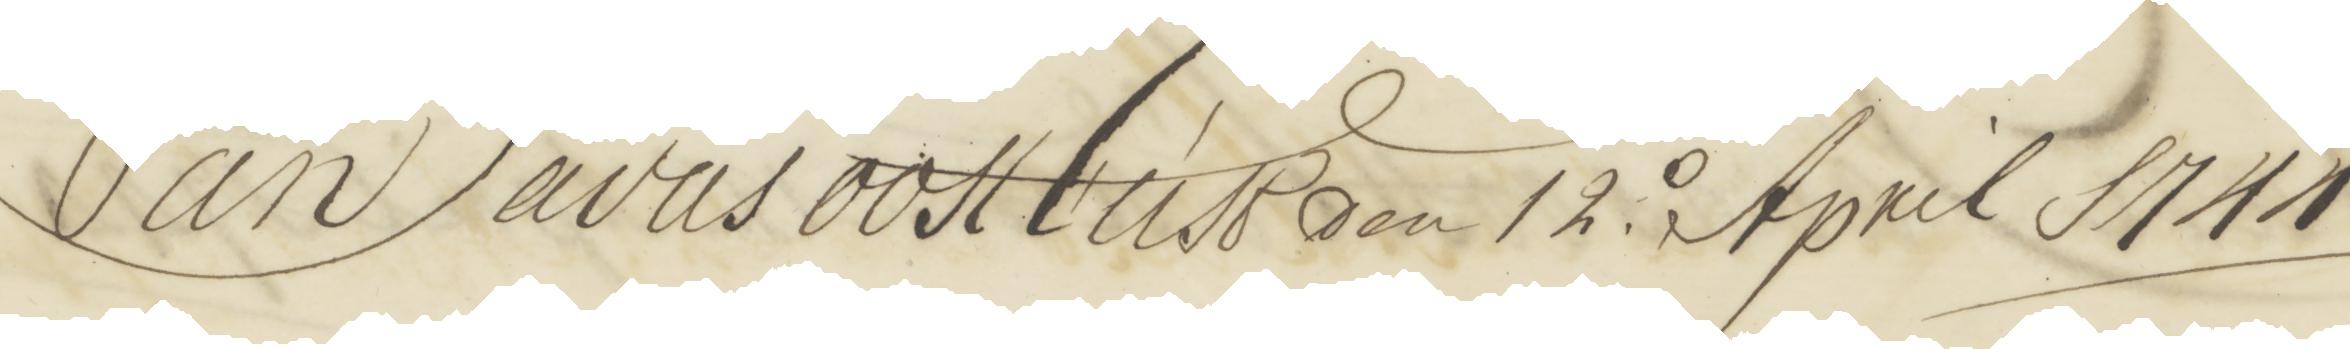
Van Javas oost Cust den 12:e April 1744
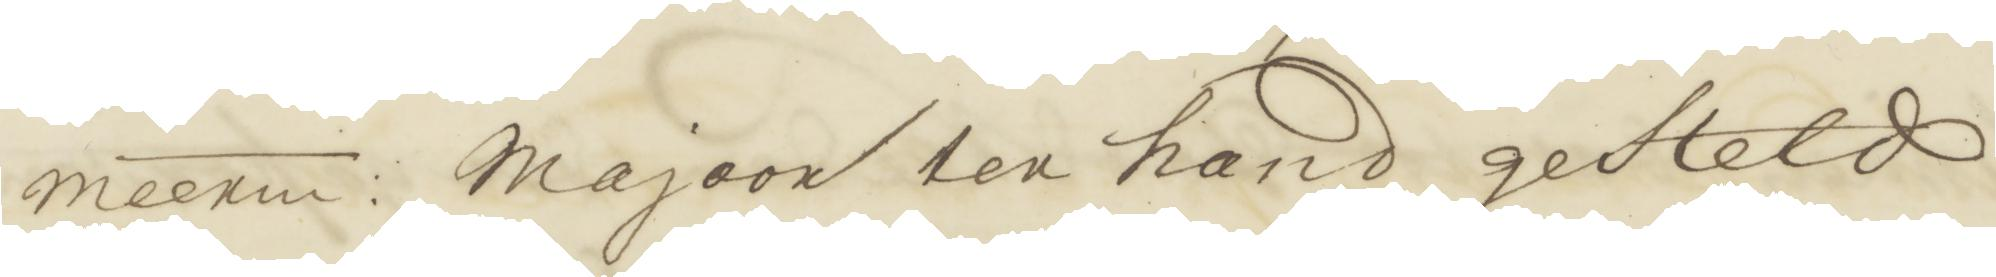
meerm: majoor ter hand gesteld
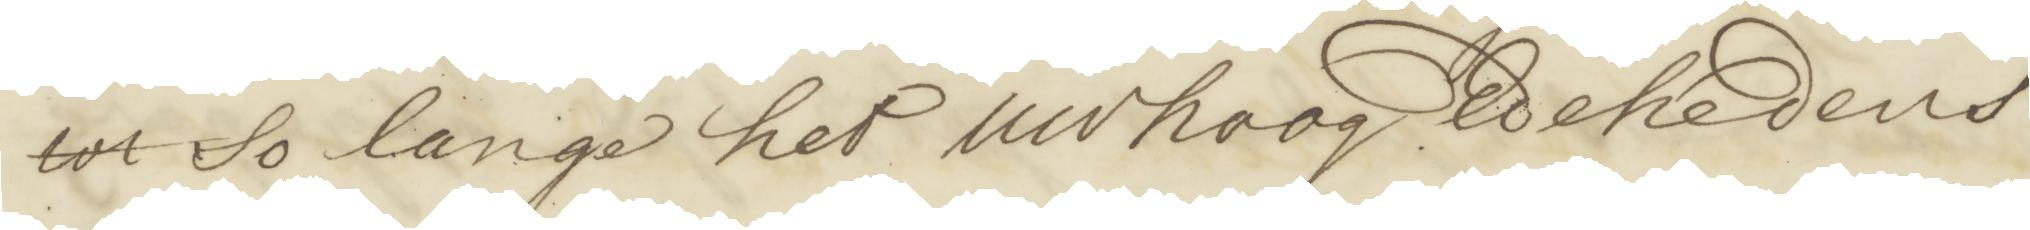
tot so lange het uw hoog Edehedens
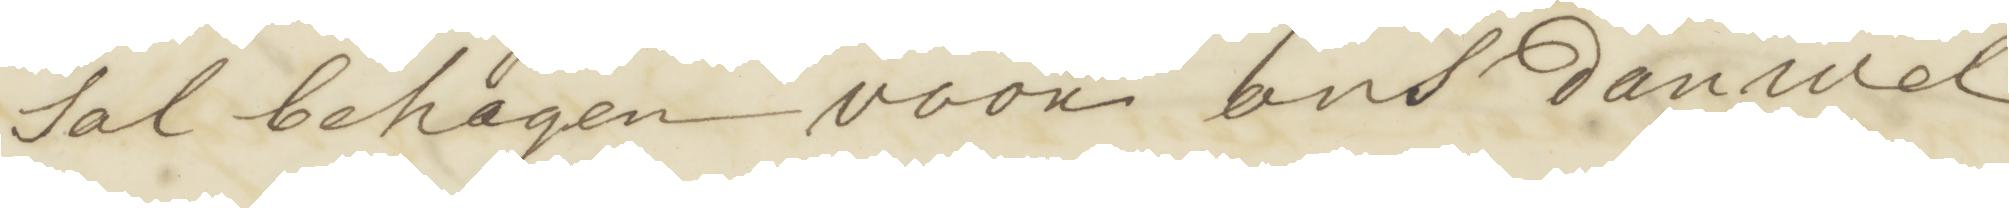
sal behagen voor ons dan wel
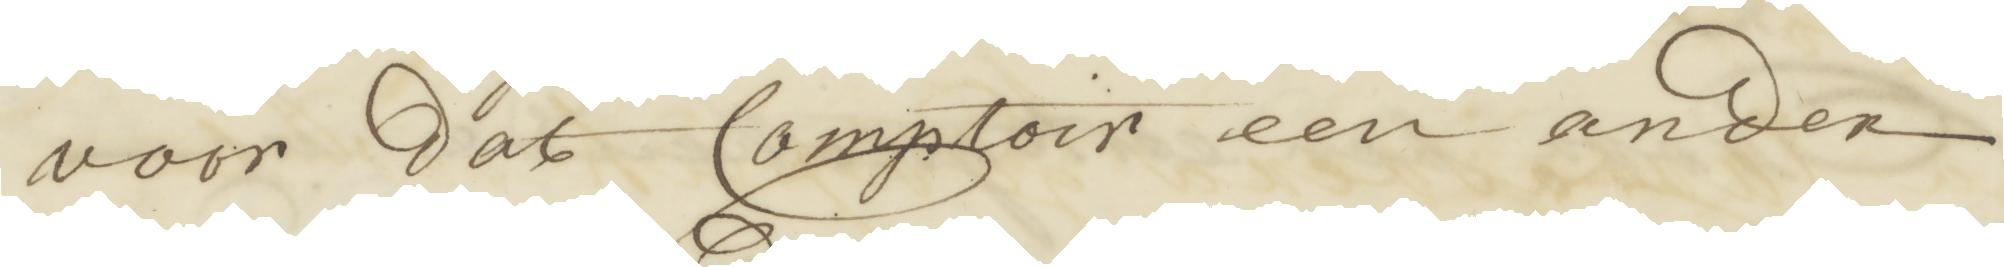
voor dat Comptoir een ander
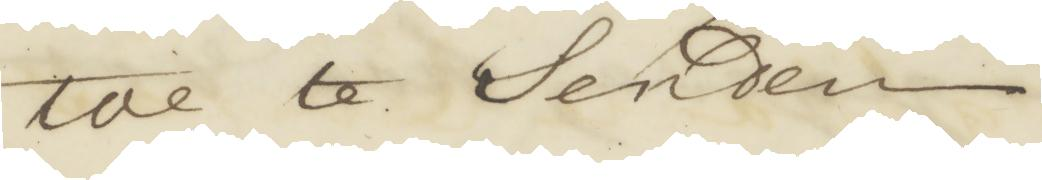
toe te senden
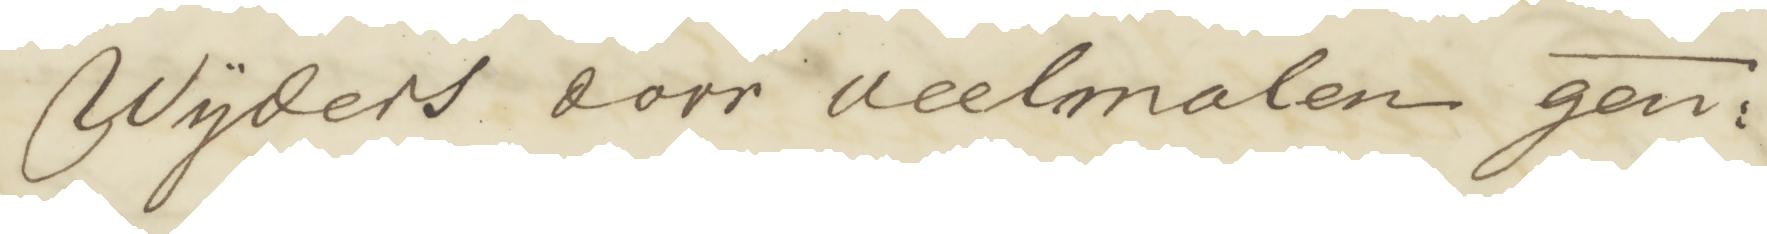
Wijders door veelmalen gen:
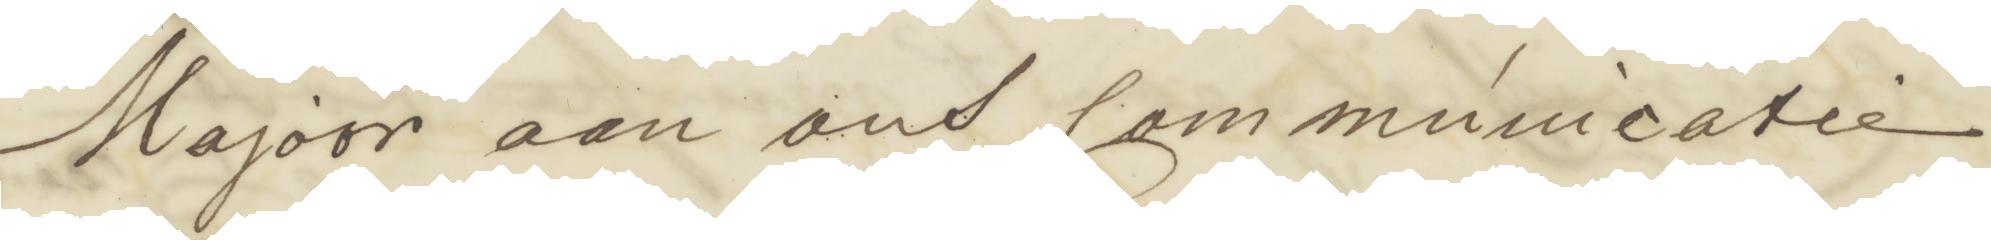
Majoor aan ons Communicatie
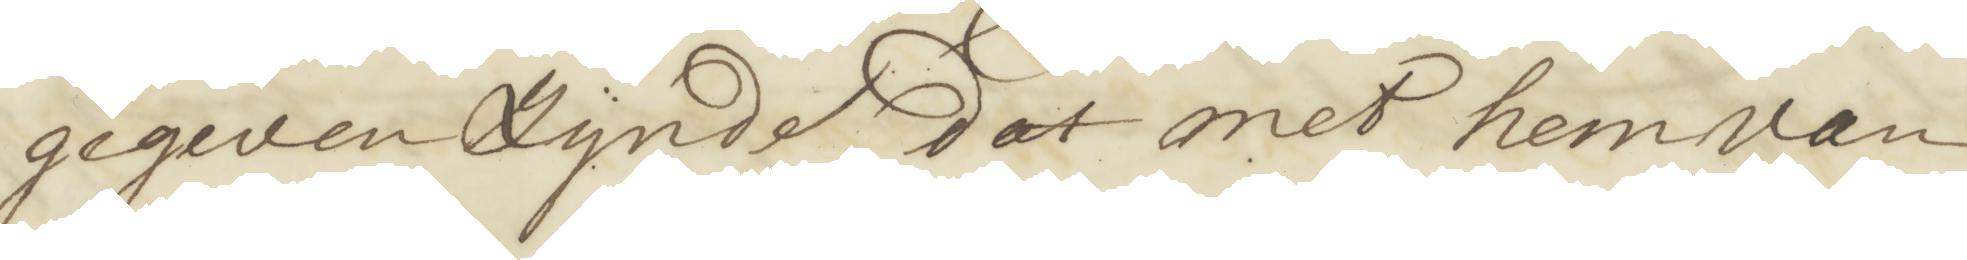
gegeven zijnde dat met hem van
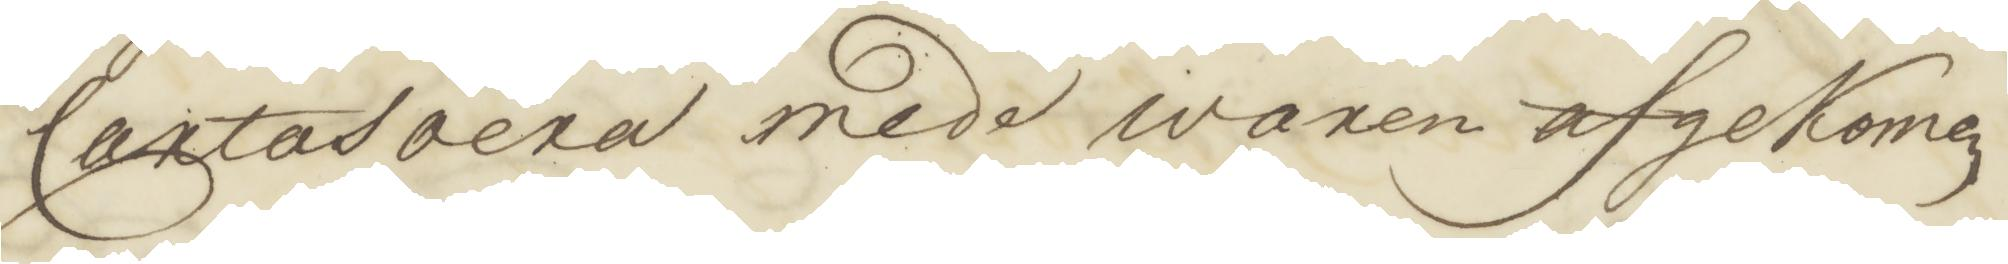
Cartasoera mede waren afgekomen
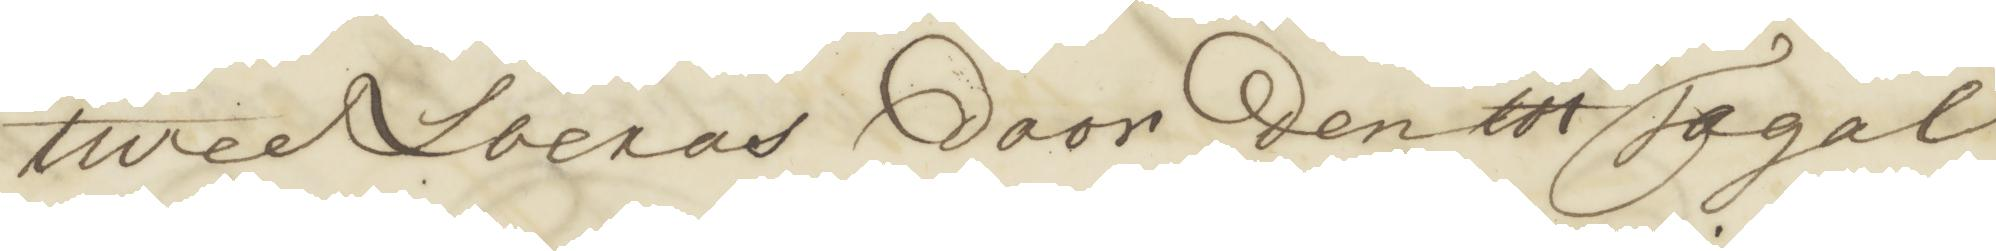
twee Loeras door den tot Tagal
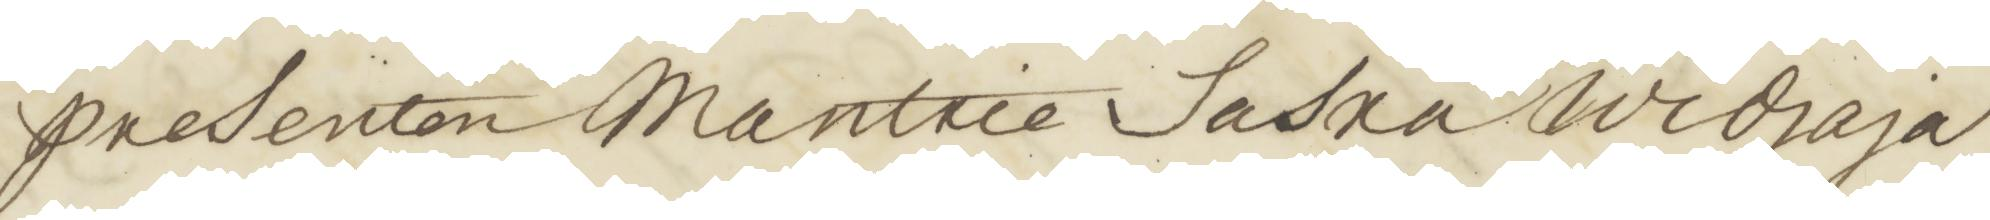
presenten mantrie sasra widjaja
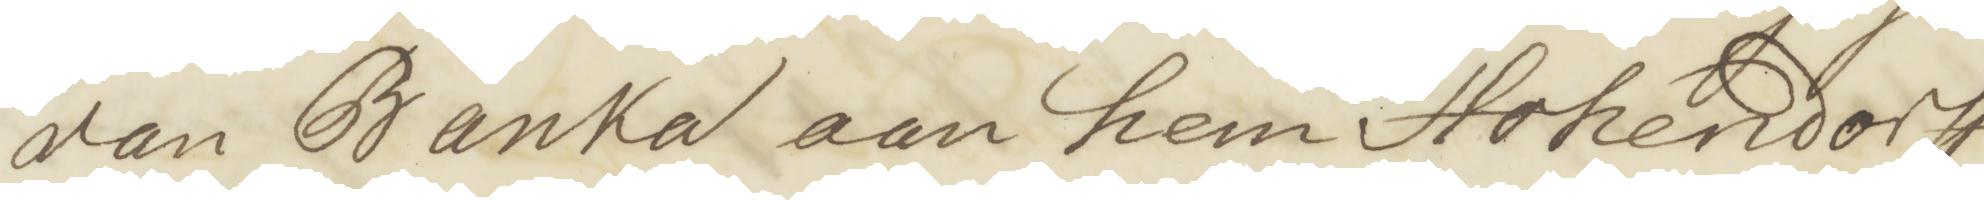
van Banka aan hem Hohendorff
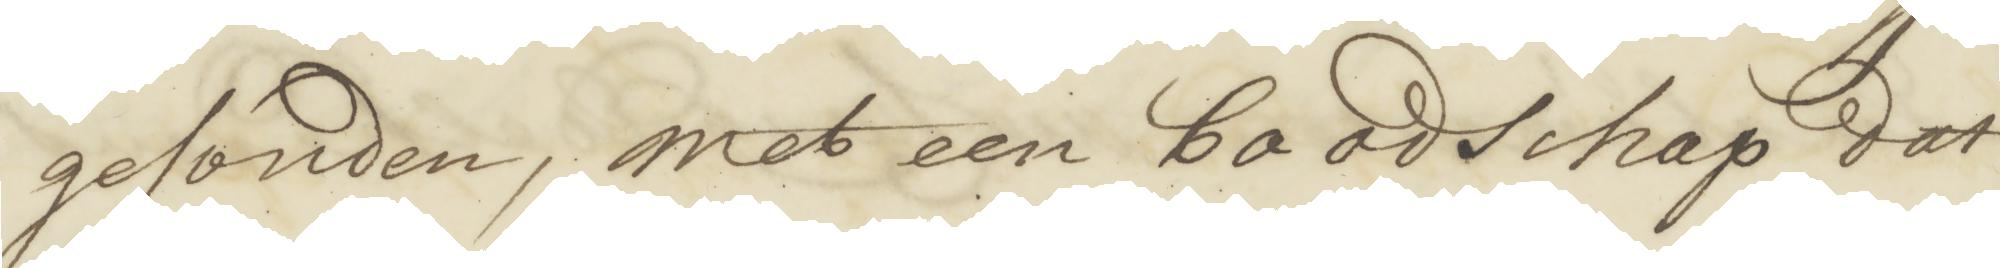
gesonden, met een boodschap dat
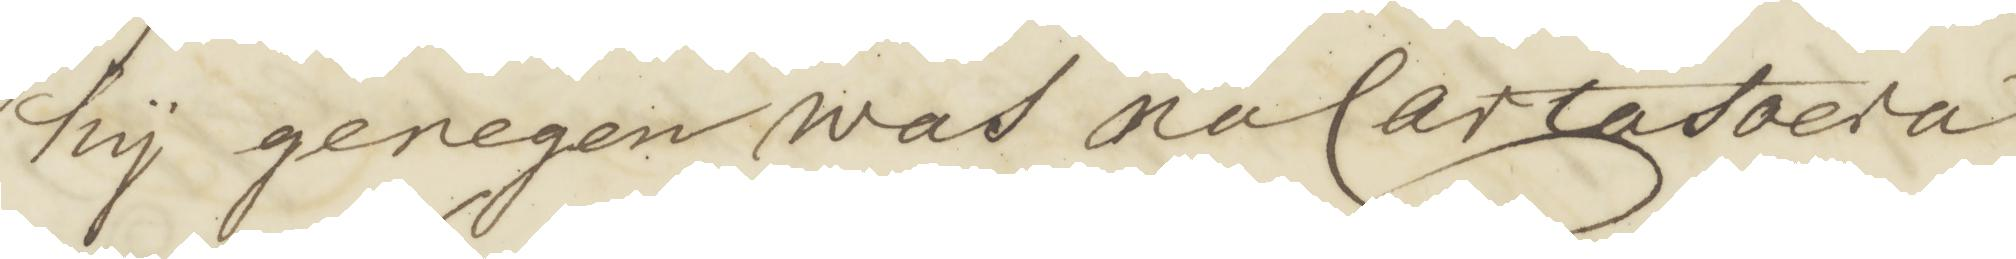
hij genegen was na Cartasoera
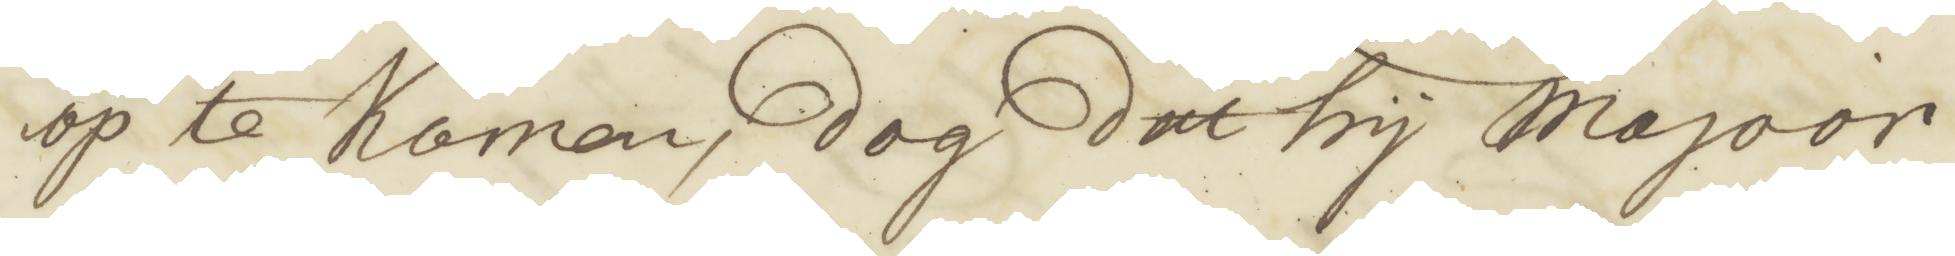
op te komen, dog dat hij majoor
